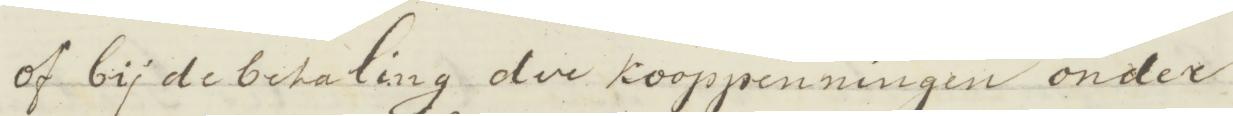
of bij de betaling der kooppenningen onder
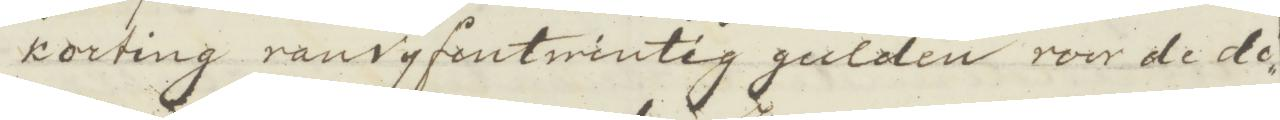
korting van vyf en twintig gulden voor de di„
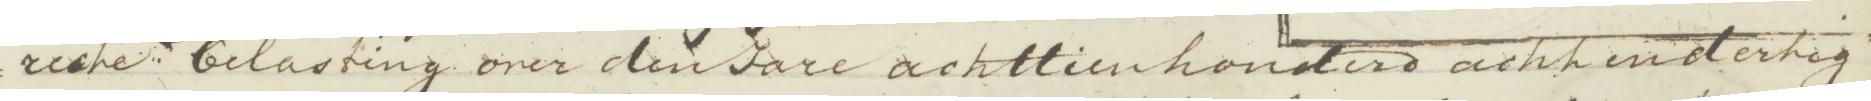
recte: belasting over den Iare achttien honderd acht en dertig
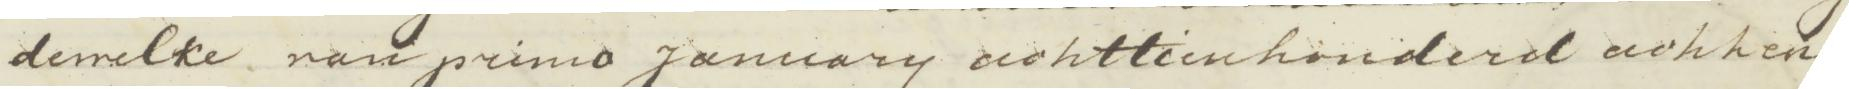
dewelke van primo january achttien honderd acht en
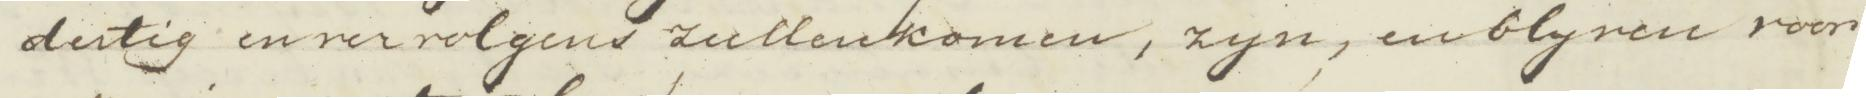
dertig en vervolgens zullen komen, zyn, en blyven voor
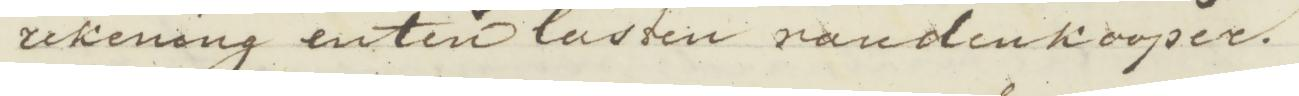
rekening en ten lasten van den kooper.
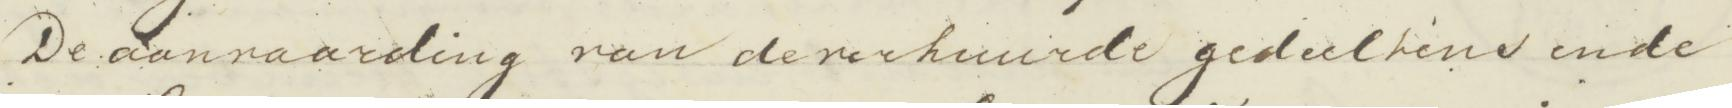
De aanvaarding van de verhuurde gedeeltens in de
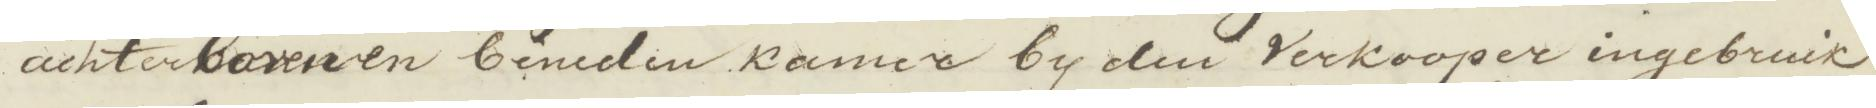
achterboven en beneden kamer by den verkooper in gebruik
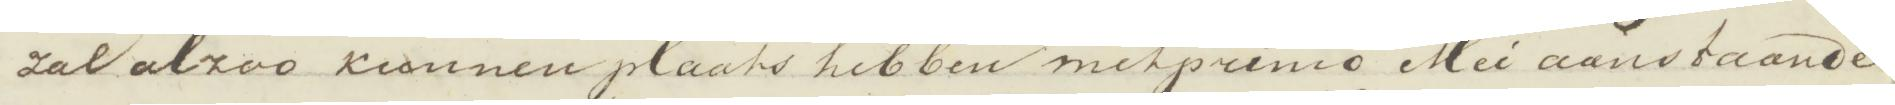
zal alzoo kunnen plaats hebben met primo Mei aanstaande
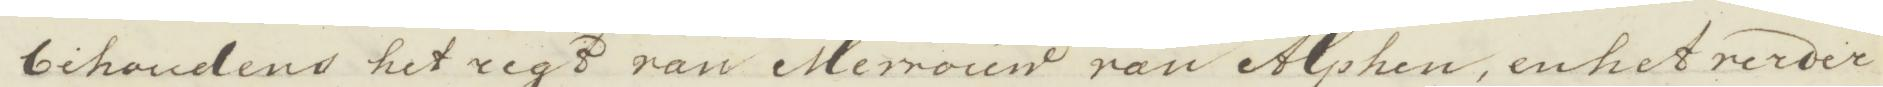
behoudens het regt van Mevrouw van Alphen, en het verder
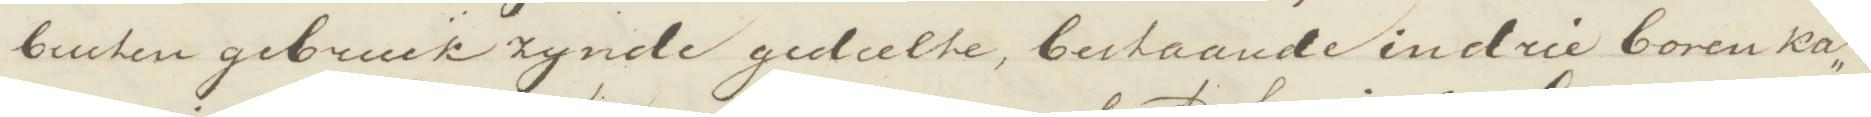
buiten gebruik zynde gedeelte, bestaande in drie bovenka„
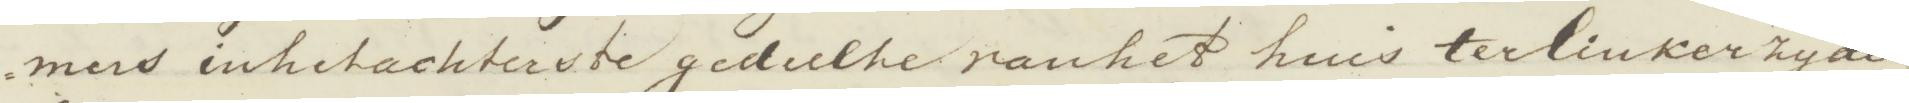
„mers en het achterste gedeelte van het huis ter linker zyde
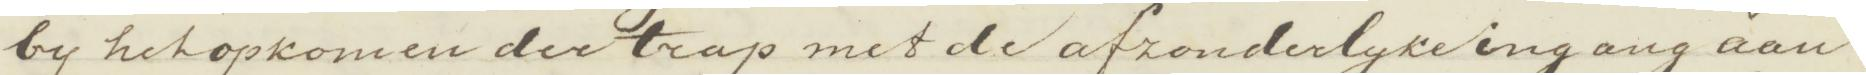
by het opkomen der trap met de afzonderlyke ingang aan
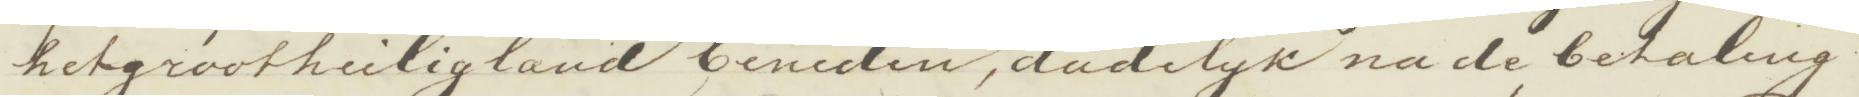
het groot heiligland beneden, dadelyk na de betaling
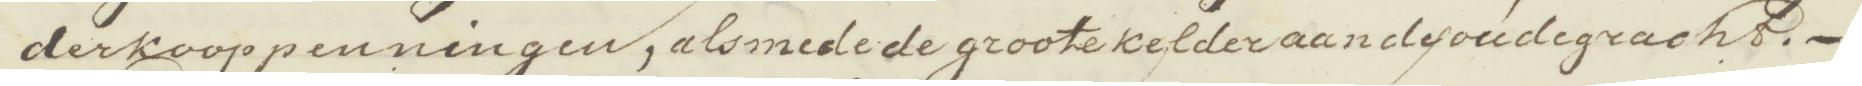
der kooppenningen, alsmede de groote kelder aan de oude gracht.-
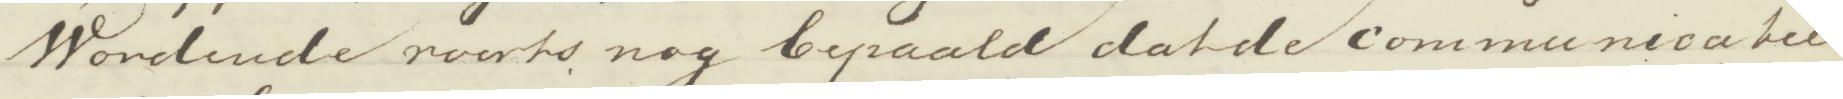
Wordende voorts nog bepaald dat de communicatie
